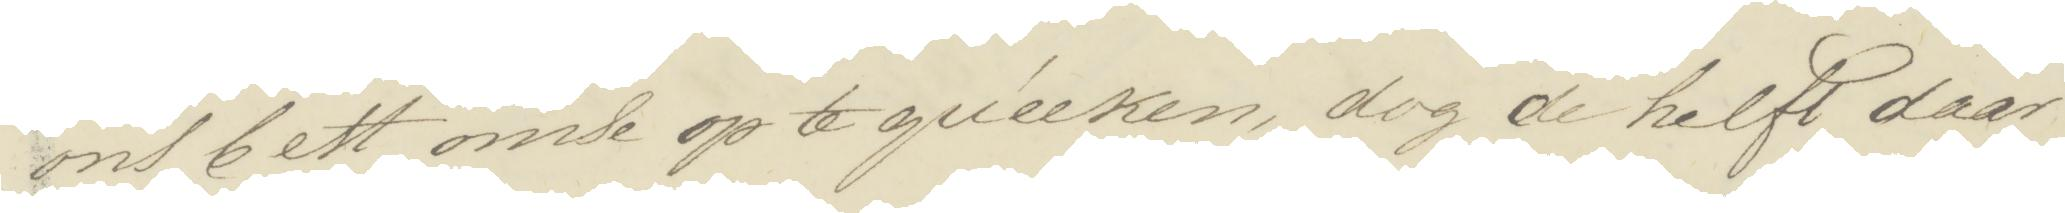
ons best omse op te queeken, dog de helft daar
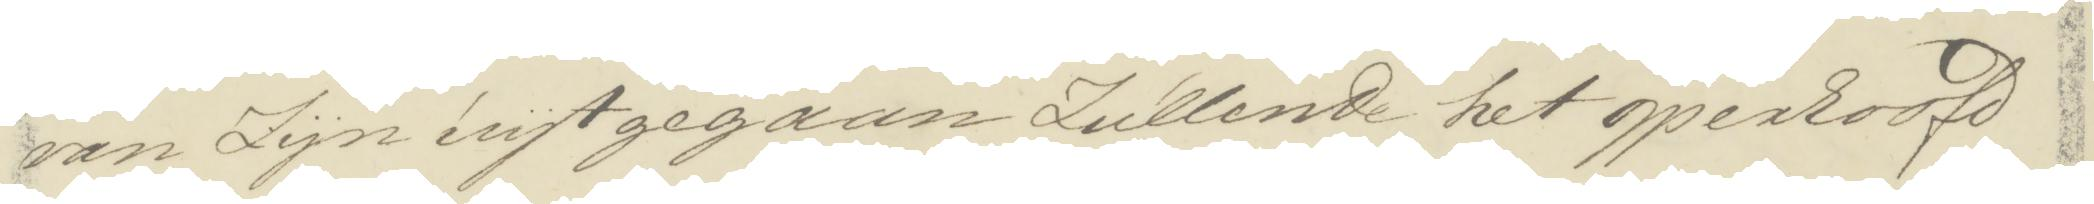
van zijn uijtgegaan zullende het opperhoofd
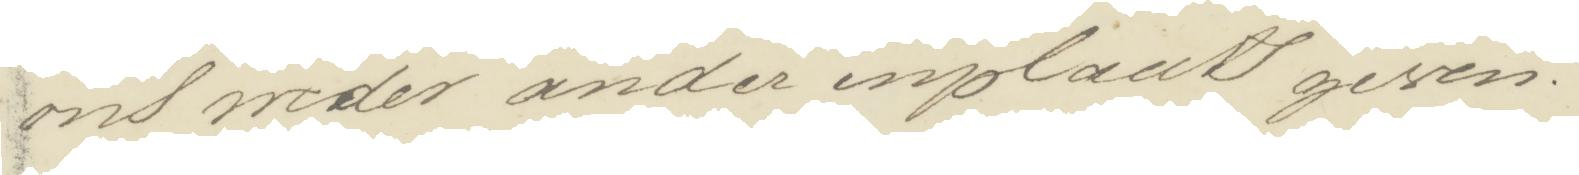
ons weder ander inplaats geven.
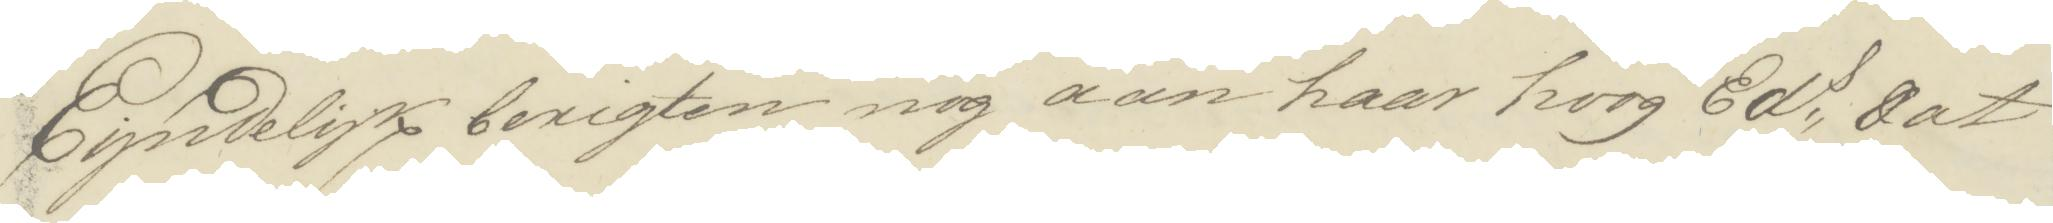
Eijndelijk berigten nog aan haar hoog Ed„s dat
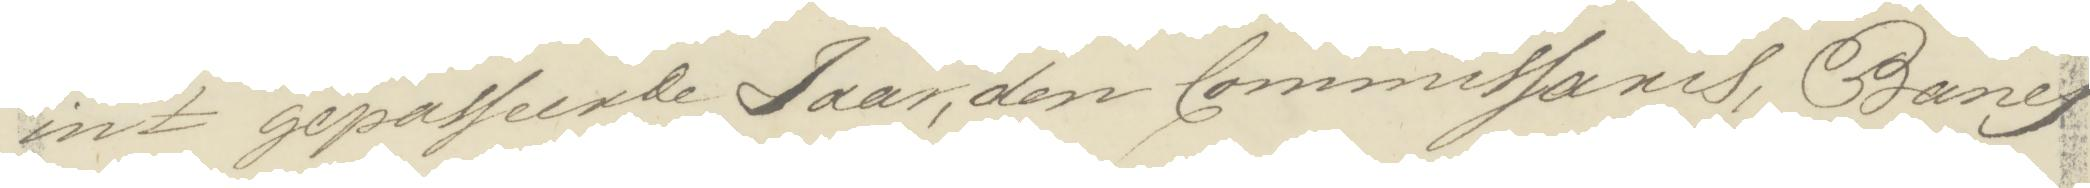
in't gepasseerde Jaar, den Commissaris, Banej
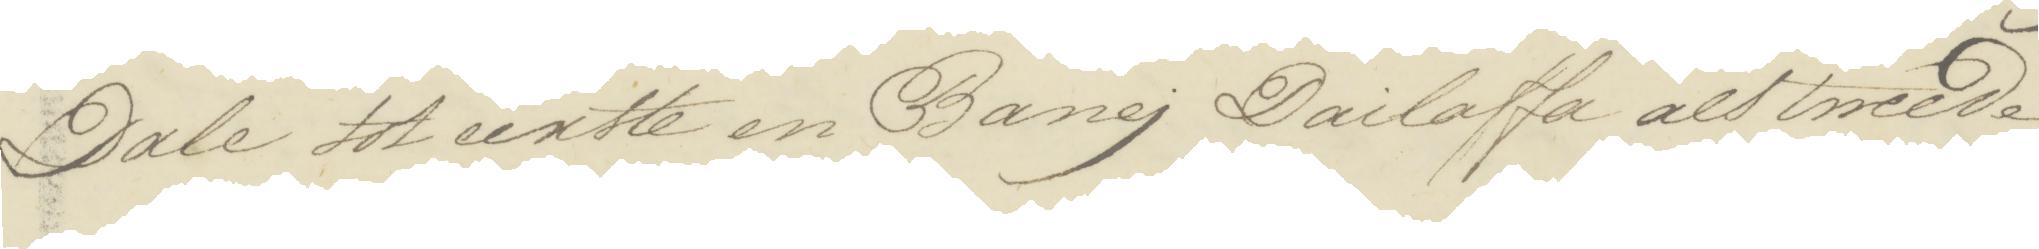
Dale tot eerste en Banej Dailaffa als tweede
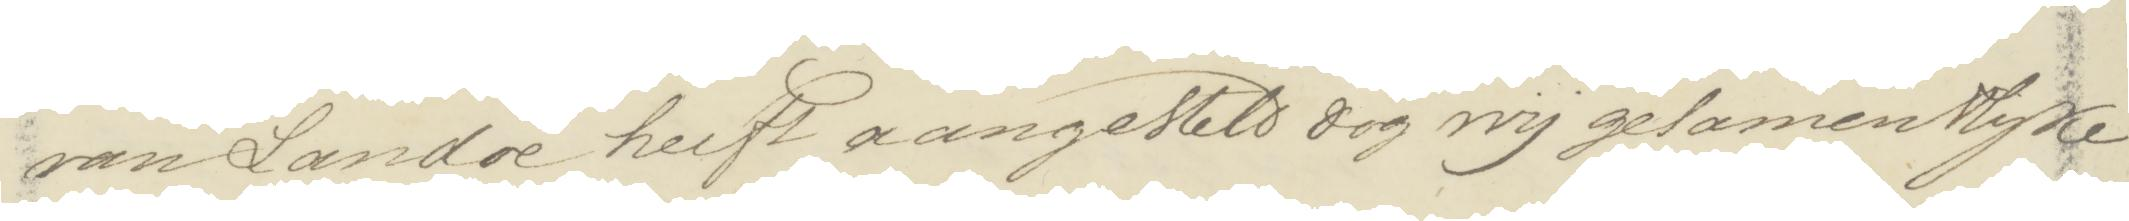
van Landoe heeft aangesteld dog wij gesamentlijke
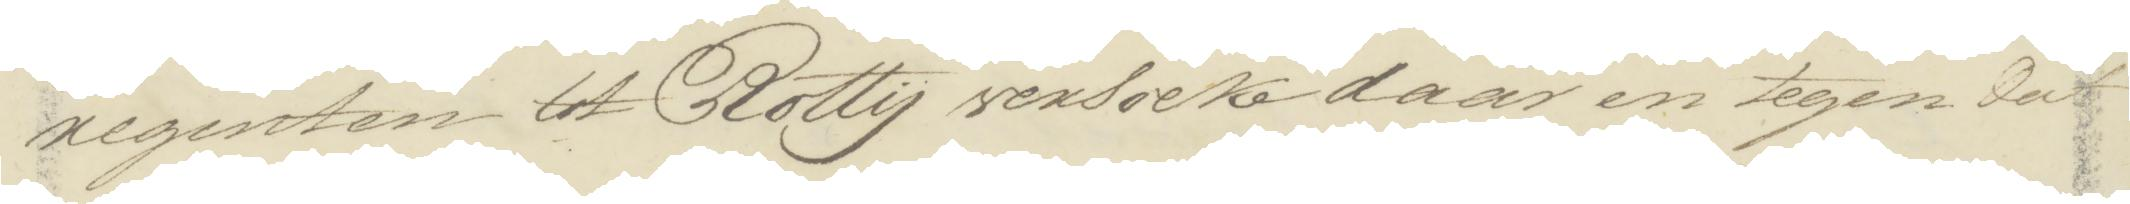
regenten tot Rottij versoeke daar en tegen dat
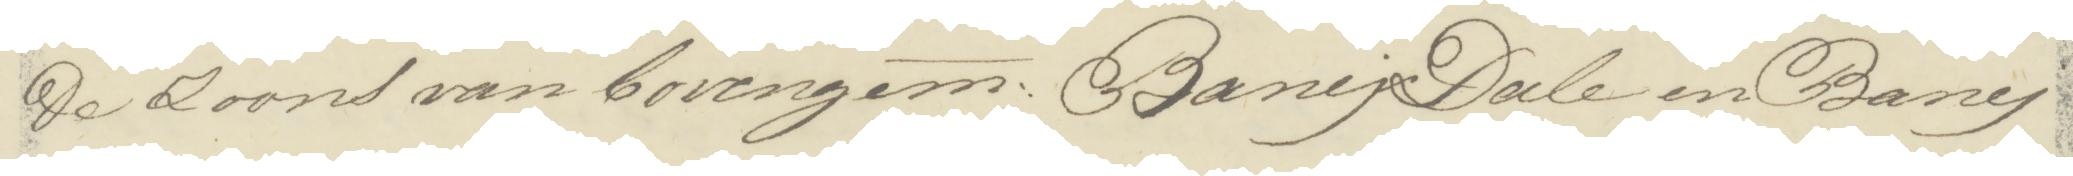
de zoons van bovengem: Banej Dale en Banej
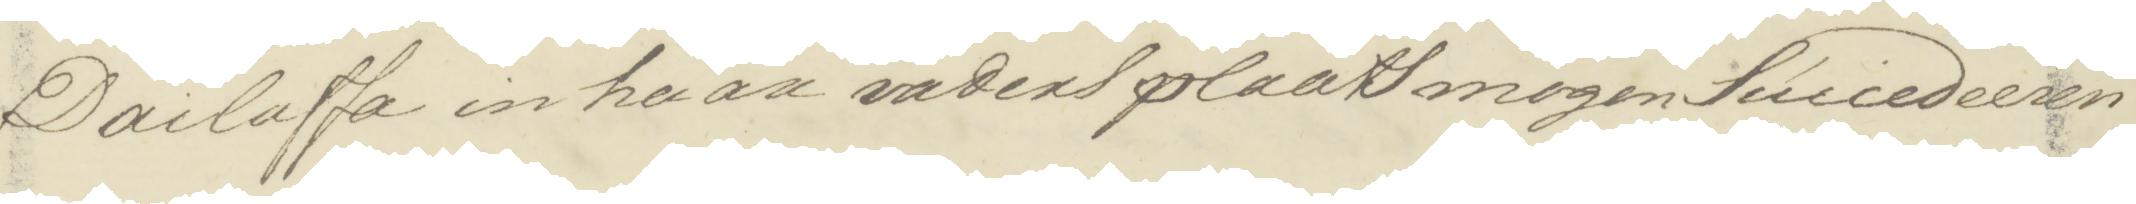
Dailaffa in haar vaders plaats mogen succedeeren
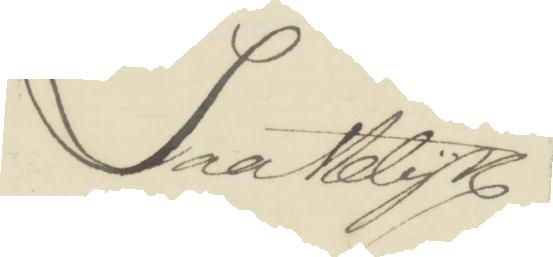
Laatselijk
